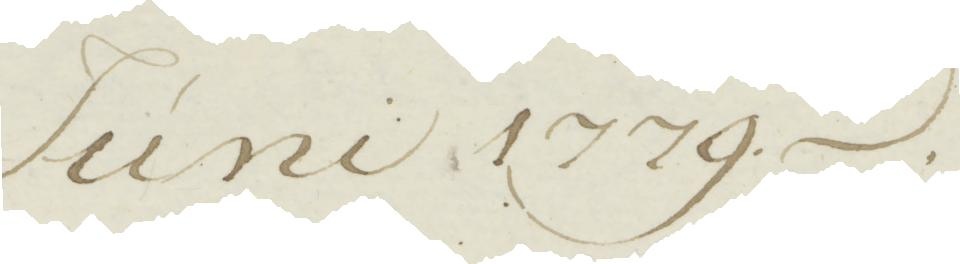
Juni 1779._.
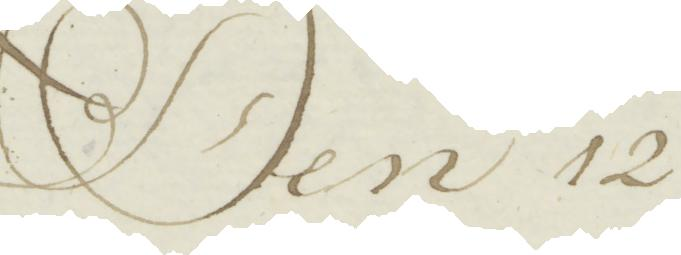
Den 12.
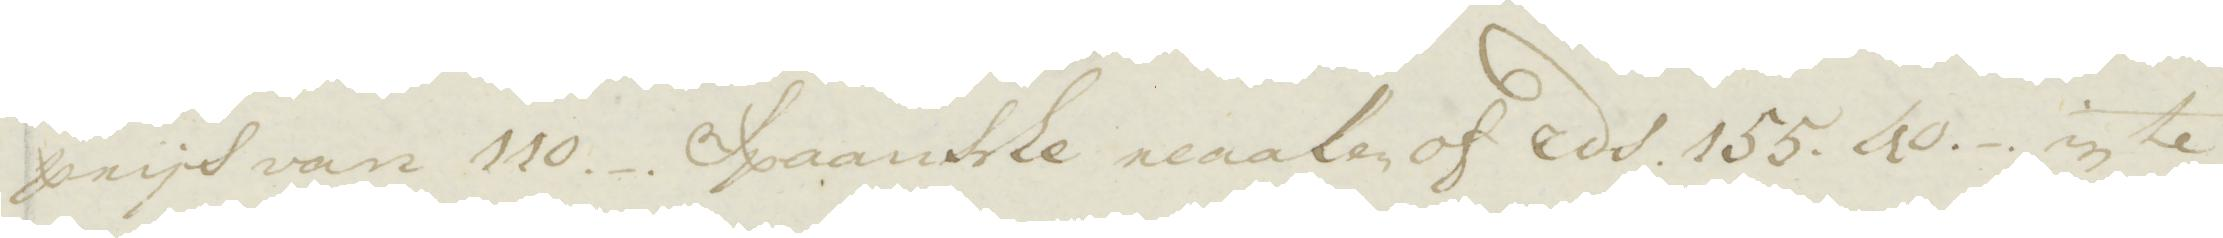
prijs van 110.–. Spaansche reaalen of rds 155. 40.–. in te
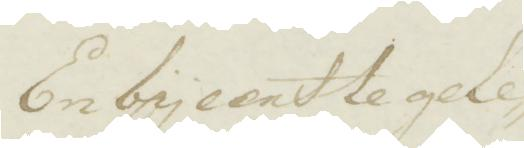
En bij eerste gele„
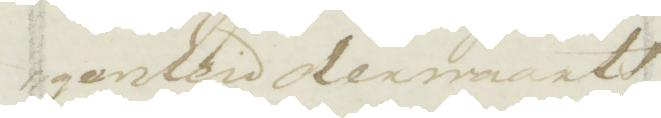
„genheid derwaarts
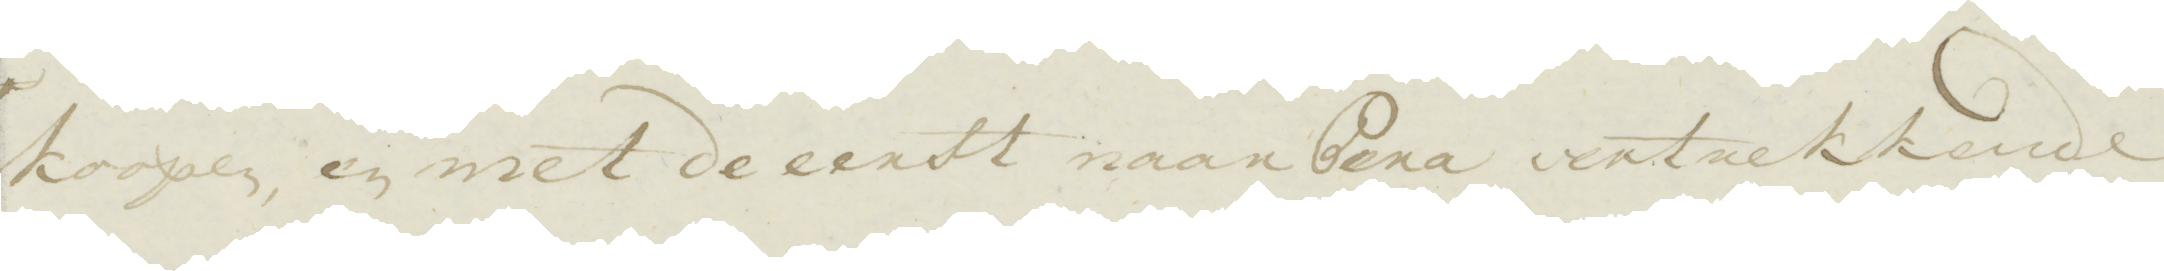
koopen, en met de eerst naar Pera vertrekkende
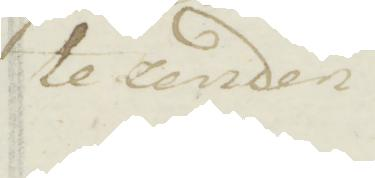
te zenden
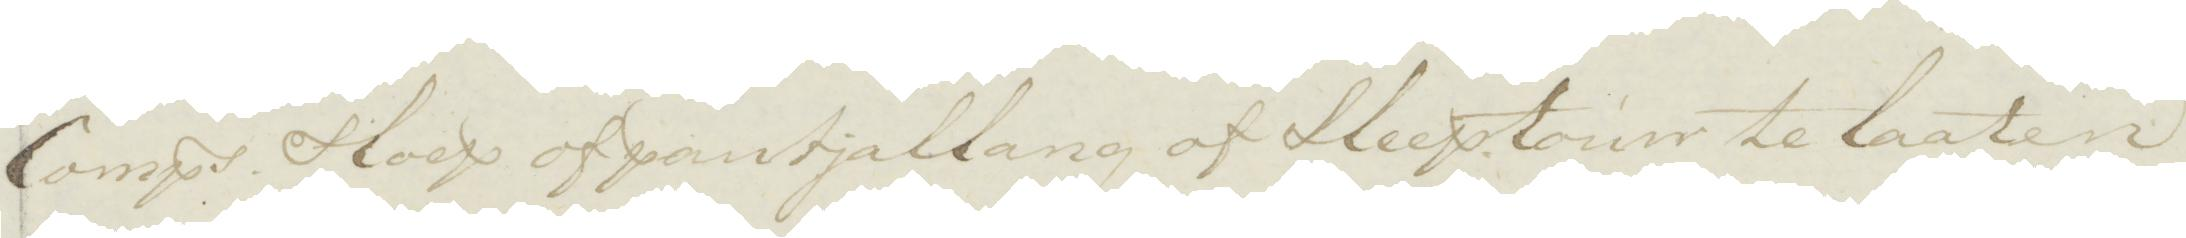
Comp.s Sloep of pantjallang of sleeptouw te laaten
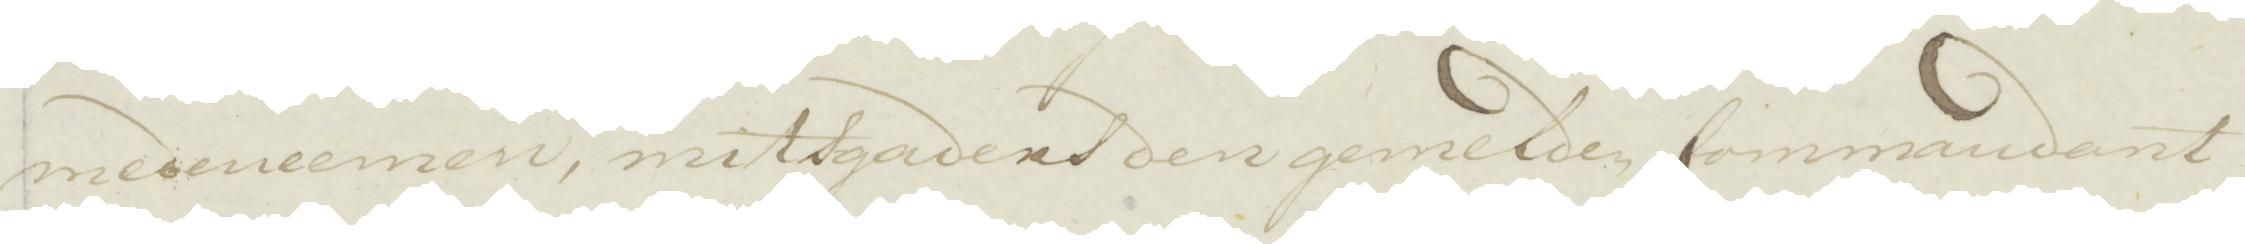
medeneemen, mitsgaders den gemelden Commandant
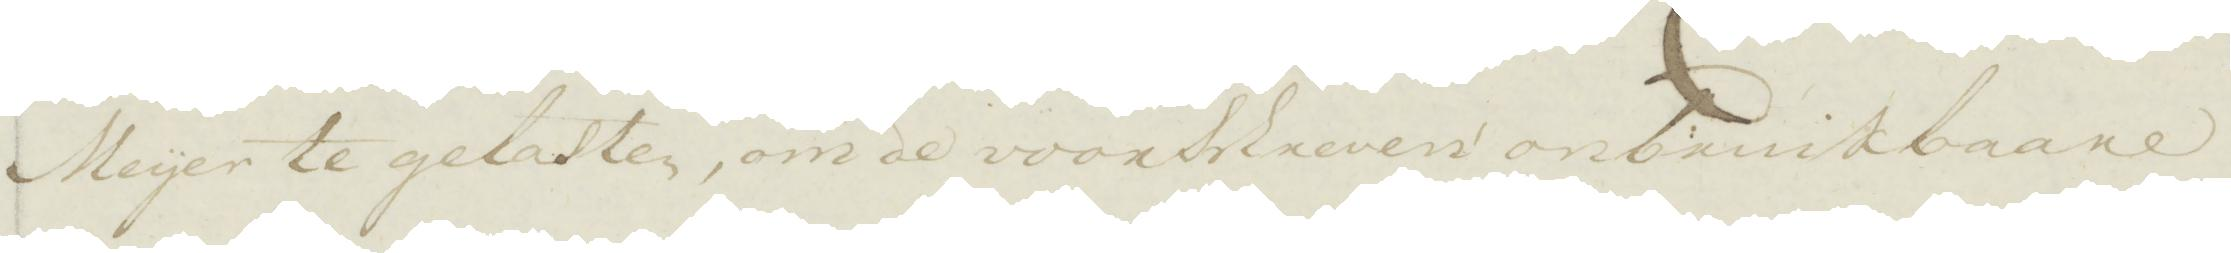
Meijen te gelasten, om de voorschreven onbruikbaare
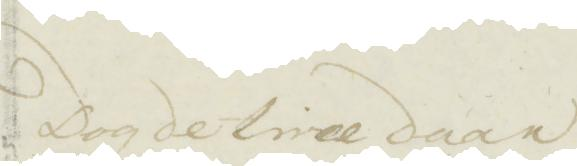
Dog de twee daar
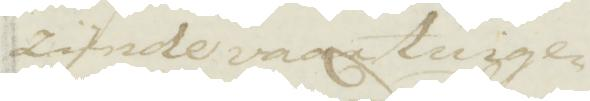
zijnde vaartuigen
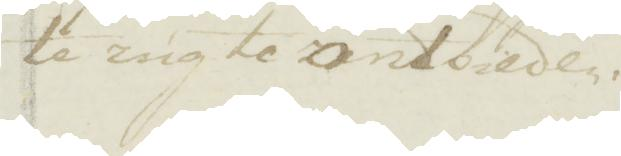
te rug te ontbieden.
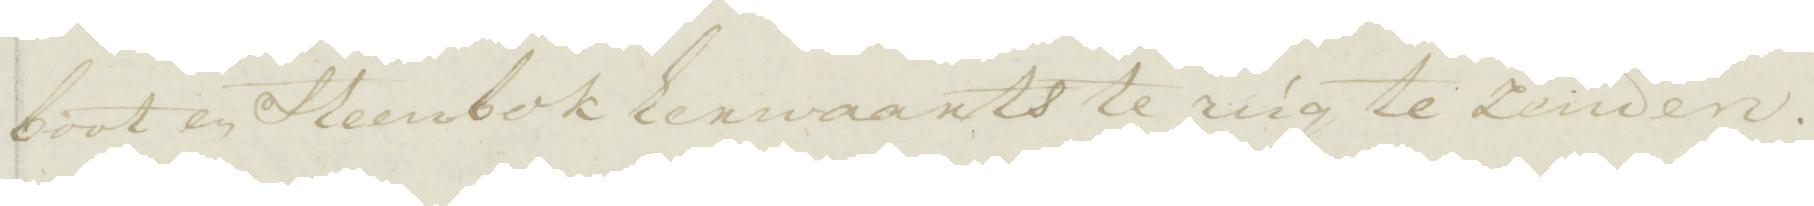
boot en steenbok herwaarts te rug te zenden.
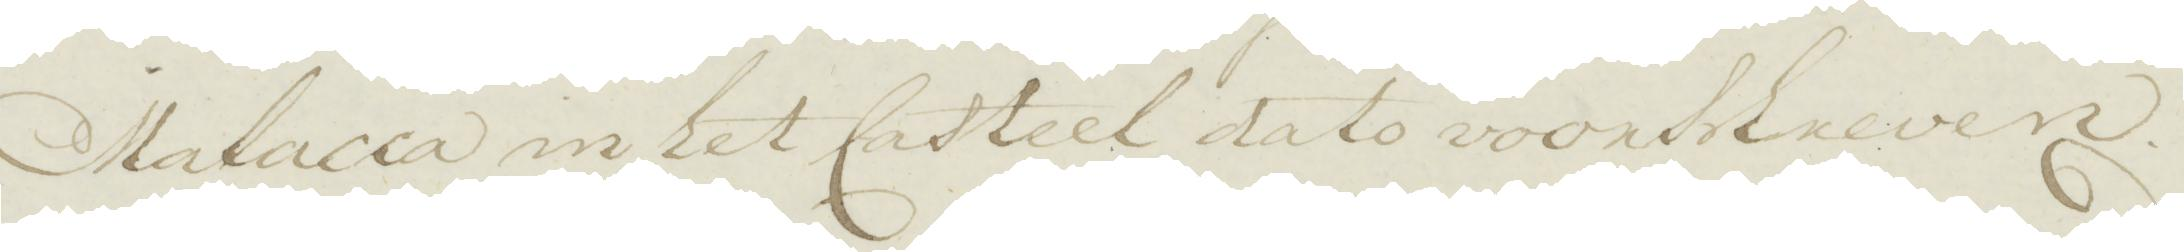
Malacca in het Casteel dato voorschreven.
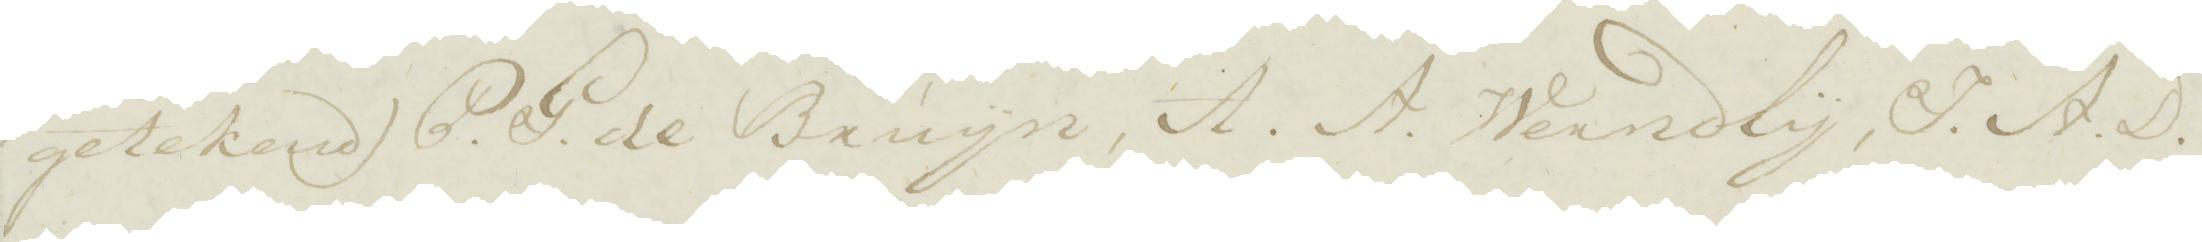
(getekend)/ P: G:de Bruijn, A. A: Werndlij, I: A: D.
